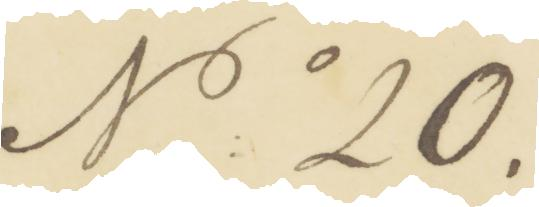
No 20.
